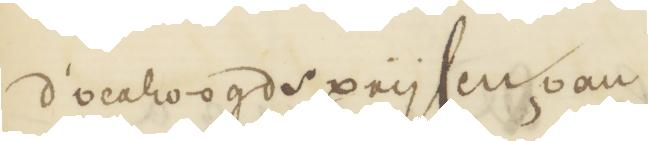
d’ verhoogde prijsen van
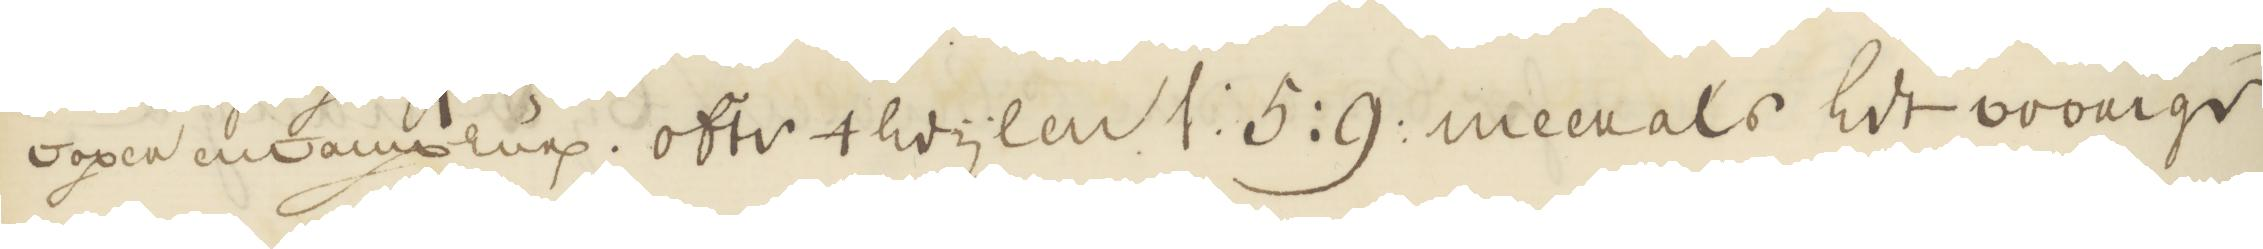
coper en camphur. ofte theijlen 1:5:9: meer als het voorige
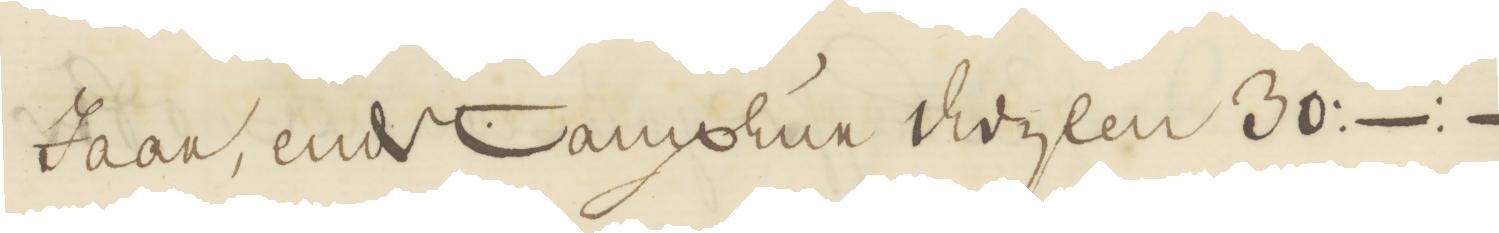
Jaar, ende Camphur theijlen 30:-:
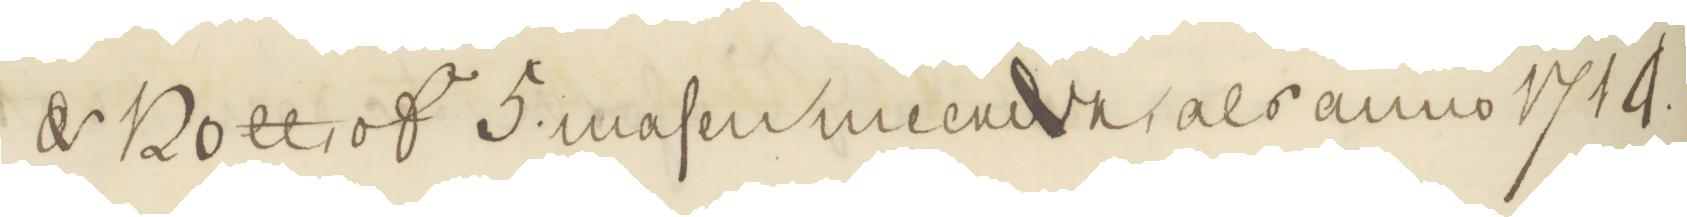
de 120 lb, of 5. masen meerder, als anno 1714.
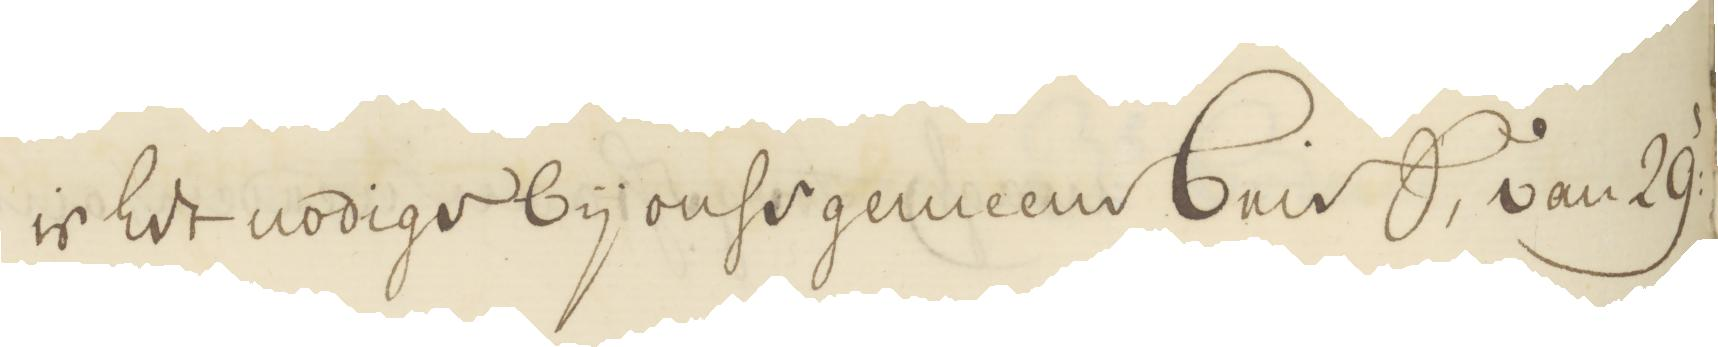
is het nodige bij onse gemeene brive, van 29:en
